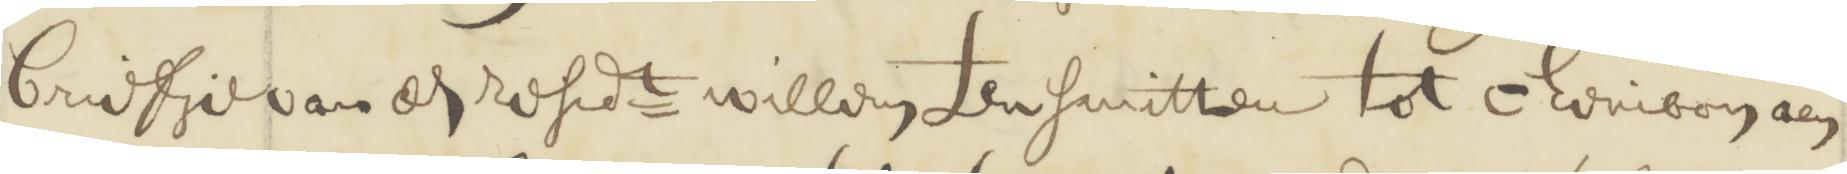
briefje van den resid=t willem ten smitten tot cheribon aen
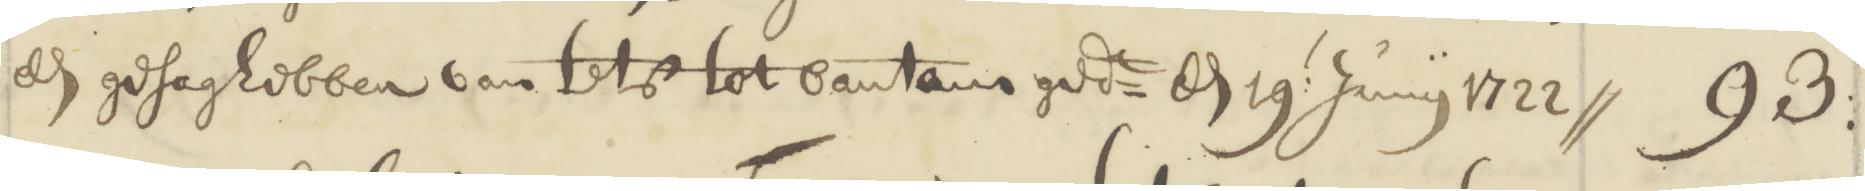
den gesaghebber van tets tot bantam ged=t den 19:' Junij 1722 „ 93
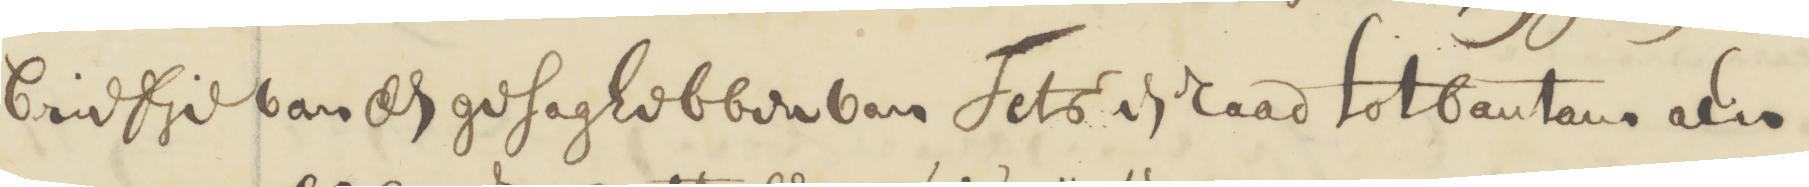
briefje van den gesaghebber van Tets en raad tot bantam aen
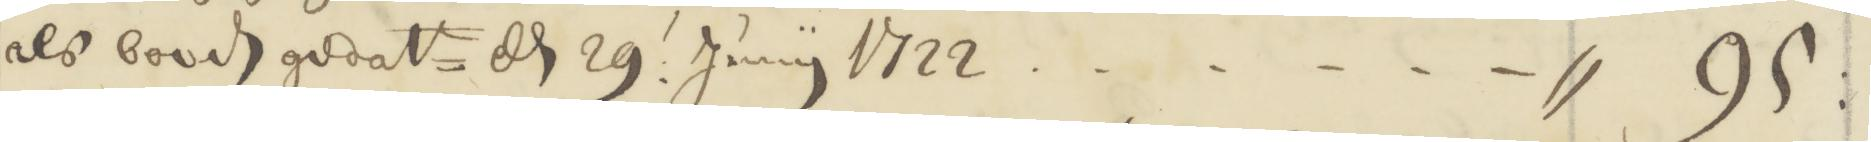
als boven gedat=t den 29:' Junij 1722 . - - - - - „ 95:
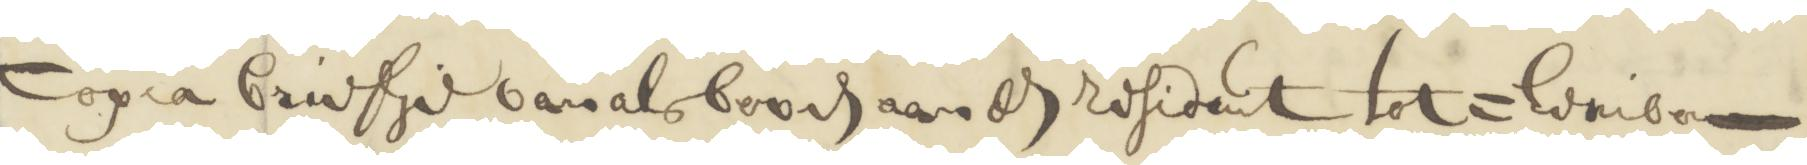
Copia briefje van als boven aan den resident tot cheribon
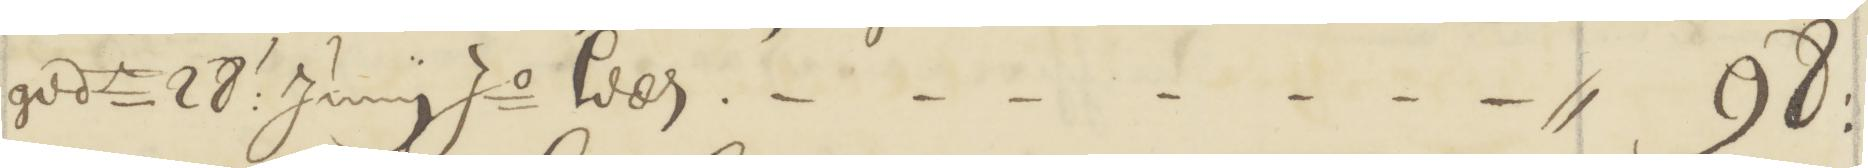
ged=t 28:' Junij J=o leden . - - - - - - - „ 98
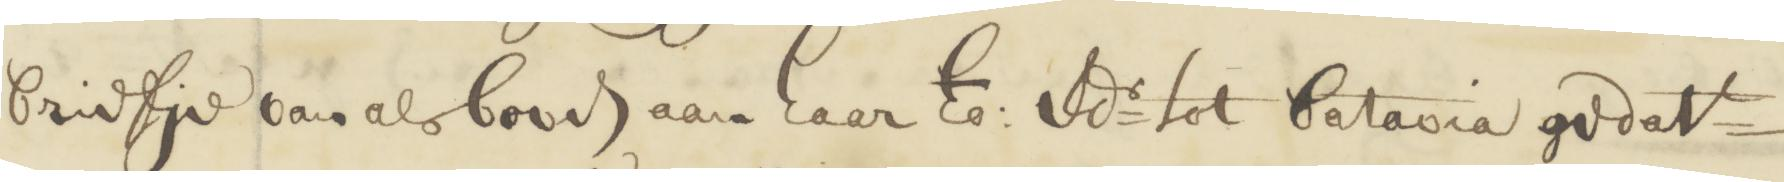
briefje van als boven aan haar Eo: Ed=s tot Batavia gedat=t
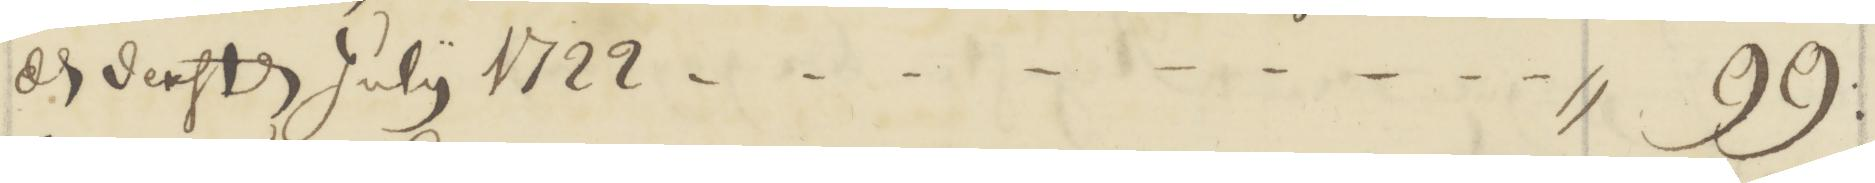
den eersten Julij 1722 - - - - - - - - - „ 99:
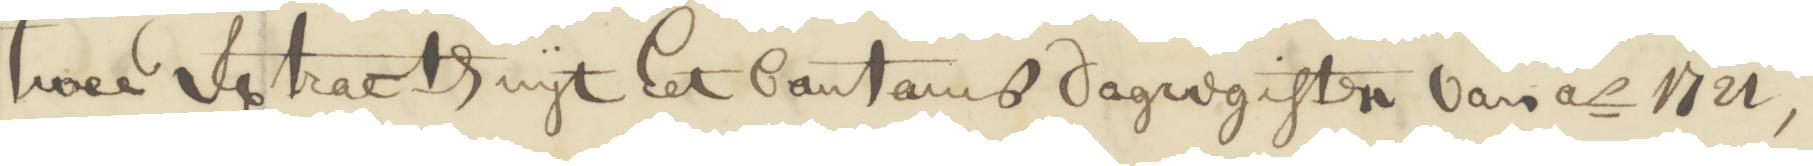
twee Extracten uijt het bantams dagregister van a=o 1721,
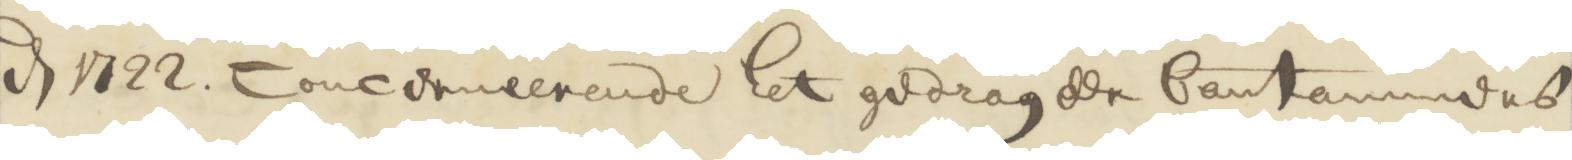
en 1722. Concerneerende het gedrag der bantammers
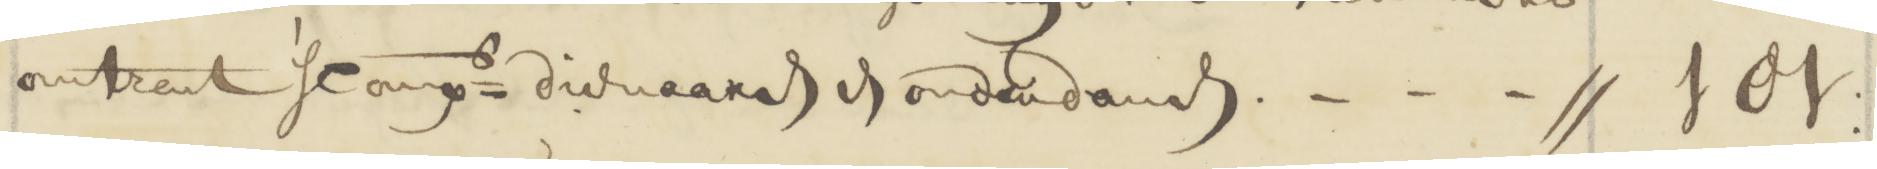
omtrent ’s Comp=s dienaaren en onderdanen . - - - „ 101:
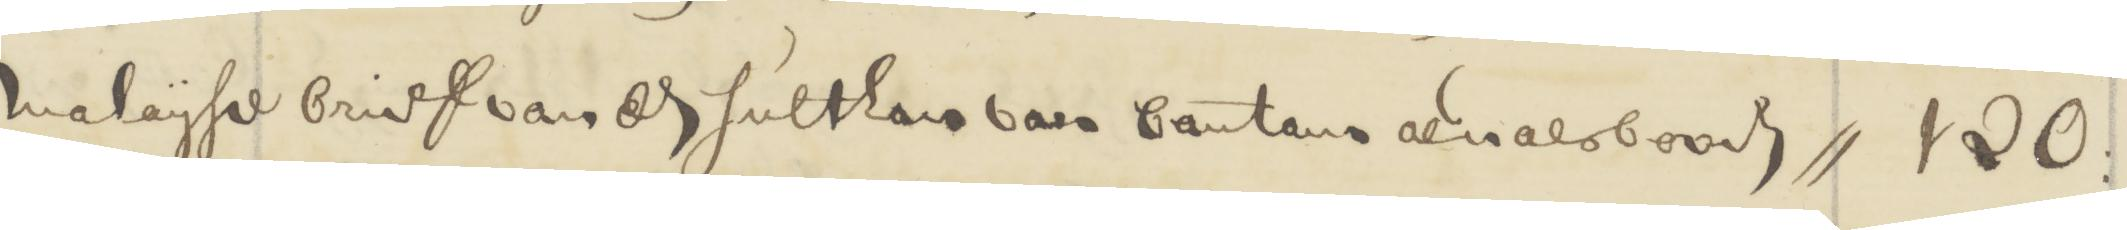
maleijse brief van den sulthan van bantam aen als boven „ 120
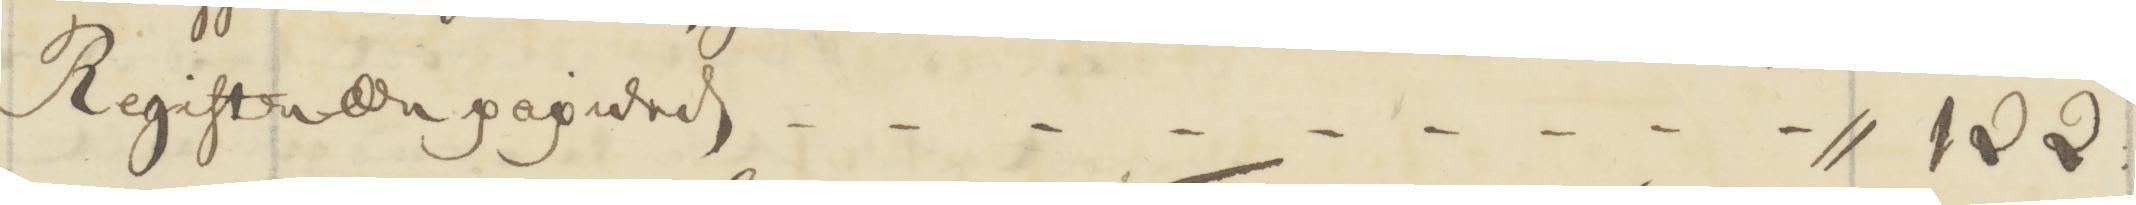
Register der papieren - - - - - - -- - „ 122:
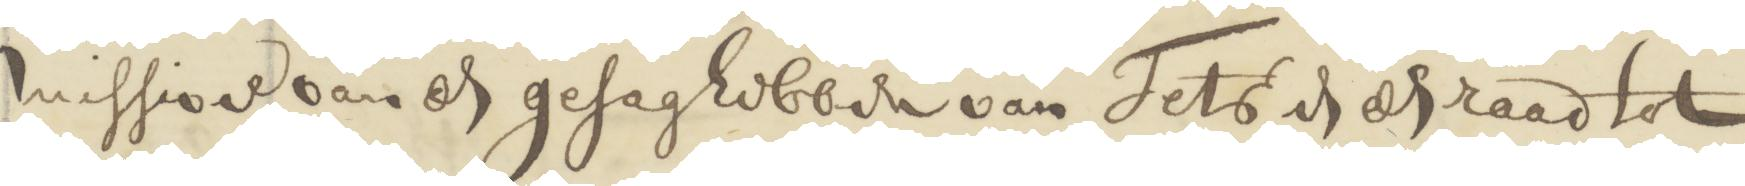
missive van den gesaghebben van Tets en den raad tot
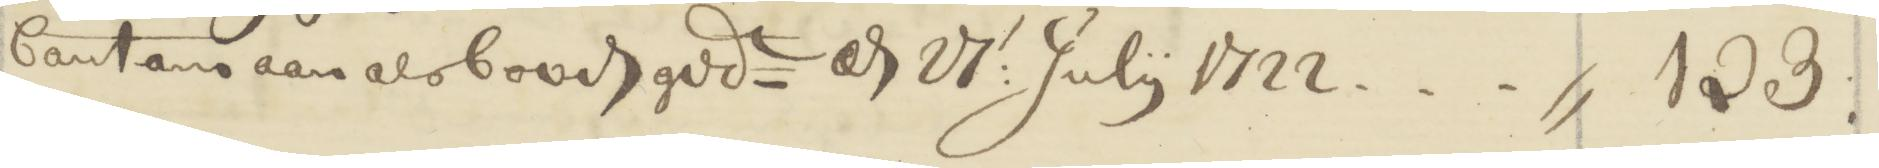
bantam aan als boven ged=t den 27:' Julij 1722 . - - „ 123:
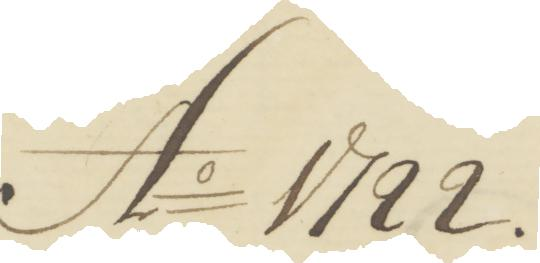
A=o 1722
